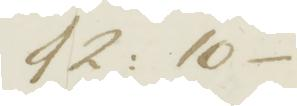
42: 10 —
